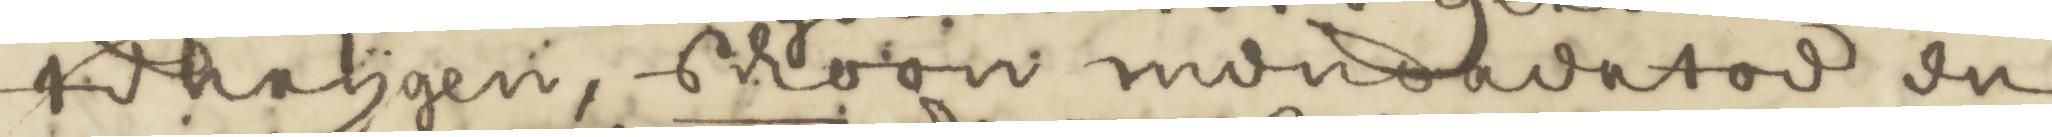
te krijgen, schoon men daertoe en
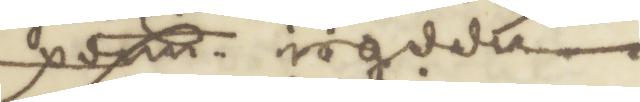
penn: is geen
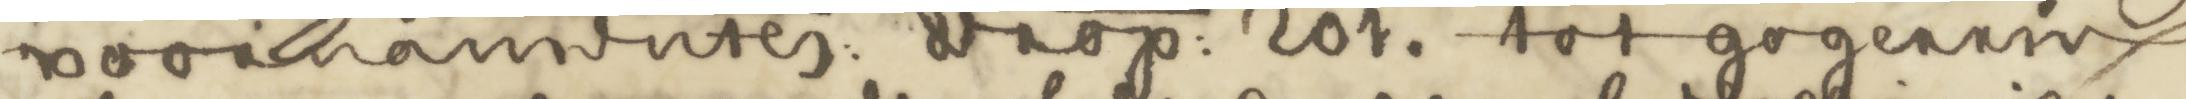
voornamentlijk de rop: 201. tot gogerrie
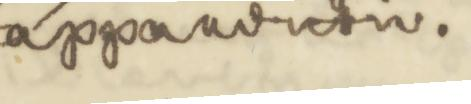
apparentie.
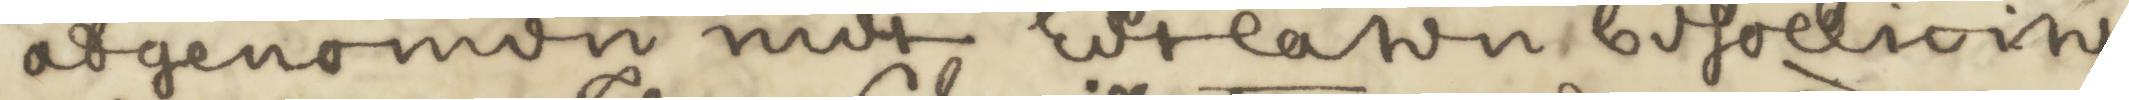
afgenomen met het laten besollicite
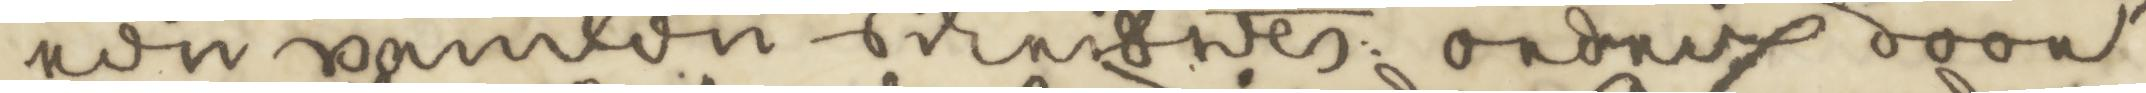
ren van Een schriftelijk ordre door
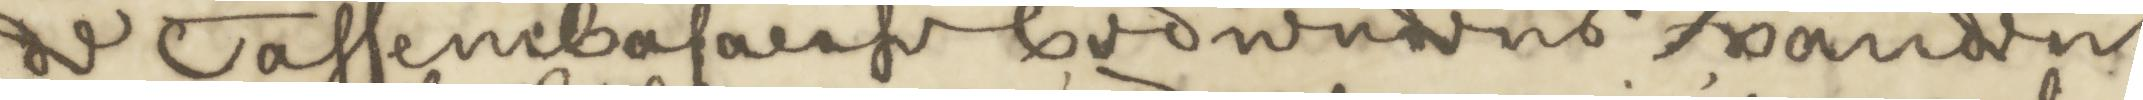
de Cassembasaerse bediendens vanden
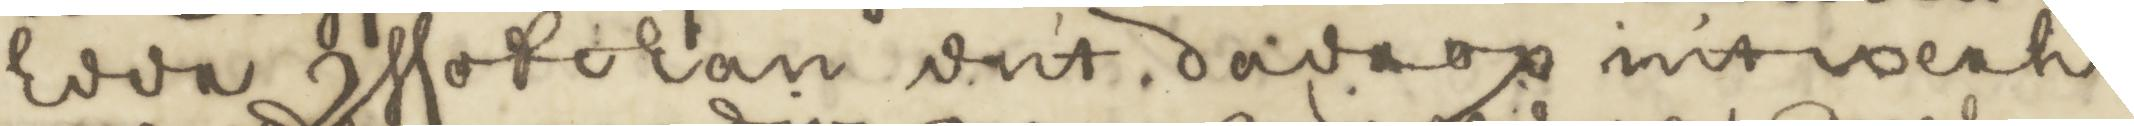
heer jssofchan en’t daerop in't werk.
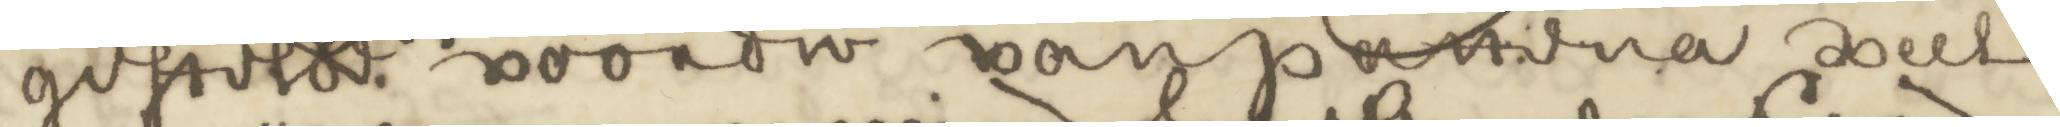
gestelde voordie van pattena veel
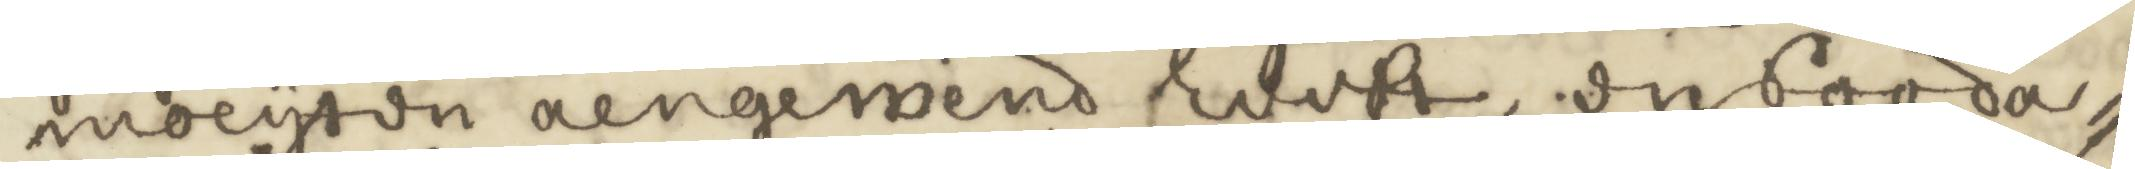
moeijten aengewend heeft, en sooda„
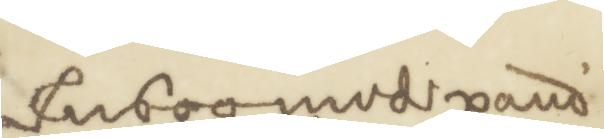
En soo mede vand'
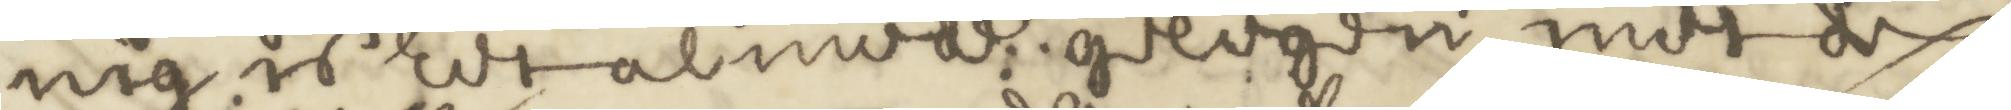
nig is het almede gelegen met de
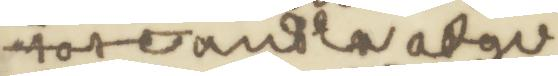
tot candha afge
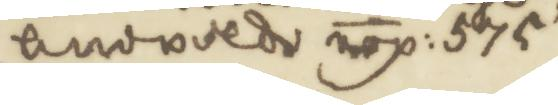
knevelde rop: 575
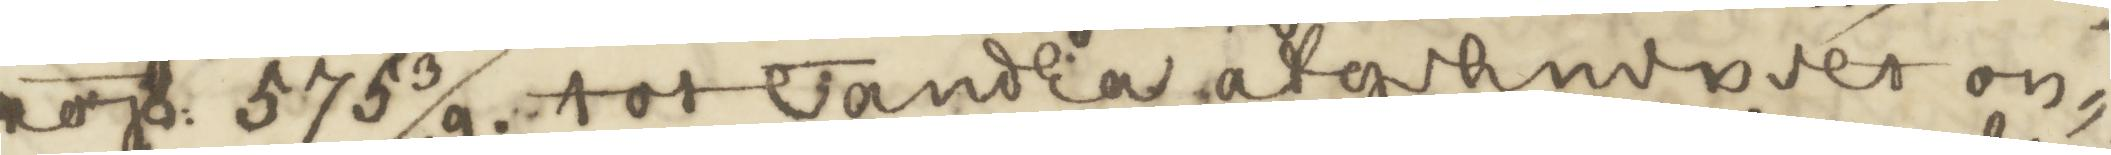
rop: 575¾. tot Candha afgeknevelt on„
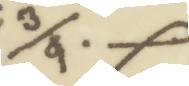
¾.
